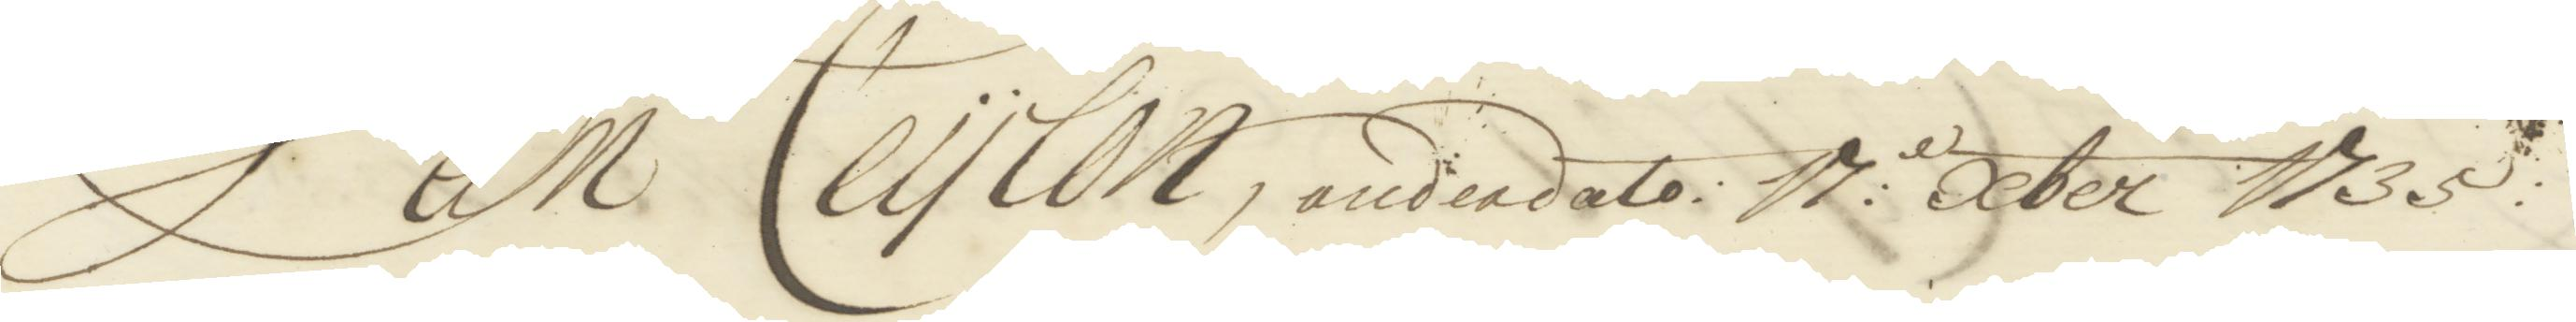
Van Ceijlon, onder dato 17:e xber 1735 :
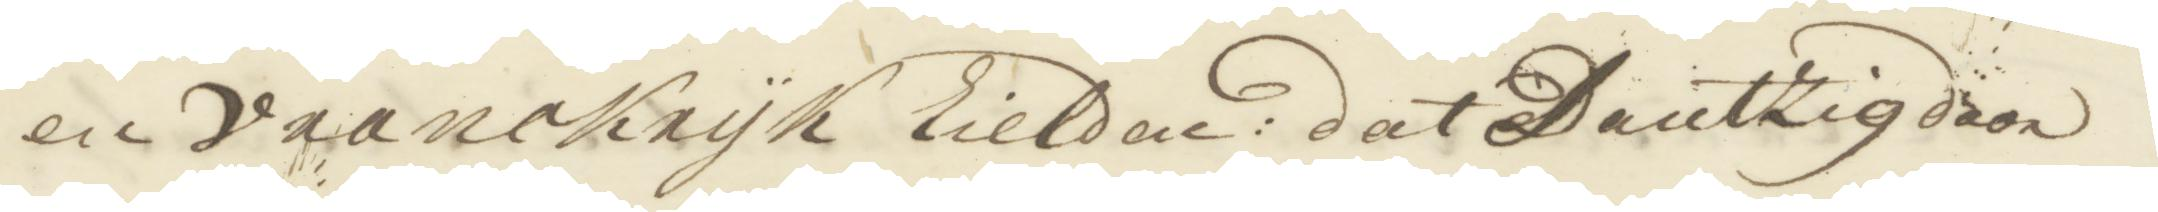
en vranckrijk hielden: dat Dantzig door
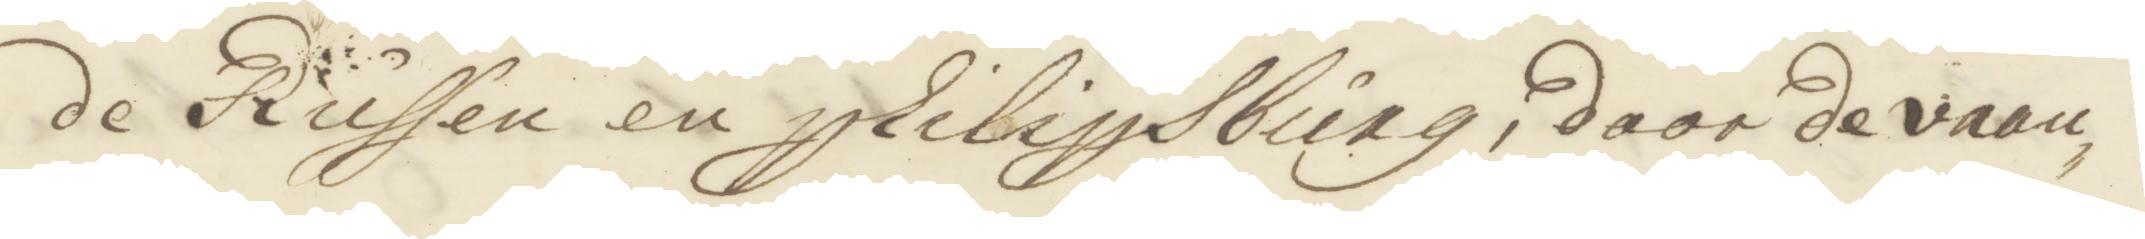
de Russen en philippsburg, door de vaan„
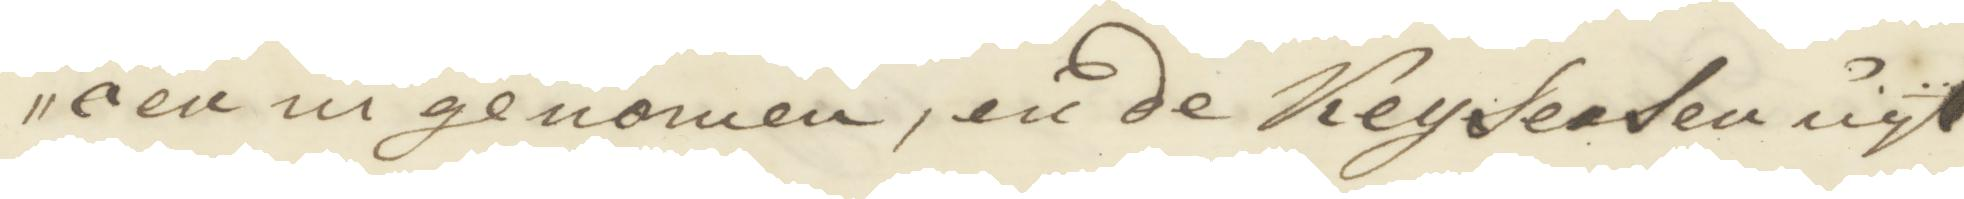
„cen in genomen, en de Keysersen uijt
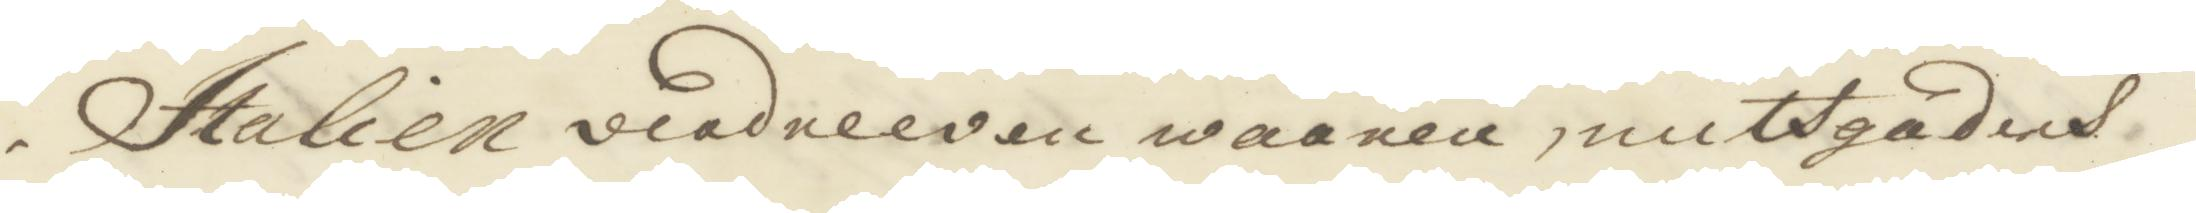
„Italien verdreeven waaren, mitsgaders
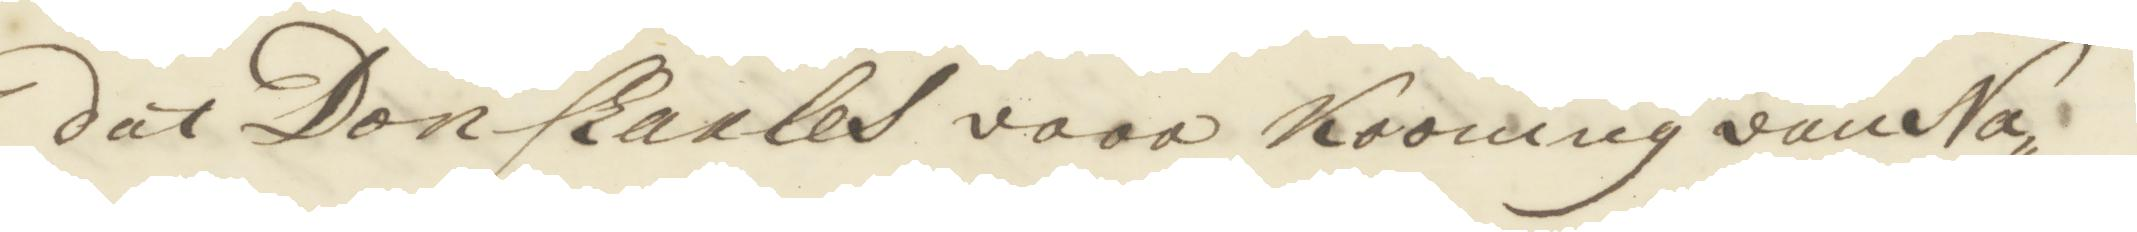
dat Don Charles voor kooning van Na„
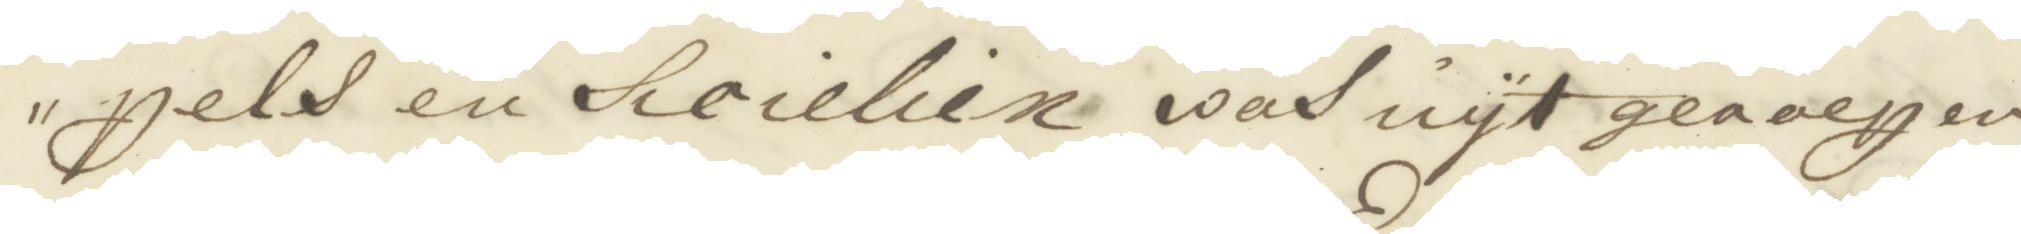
„pels en Sicielien was uijt geroepen,
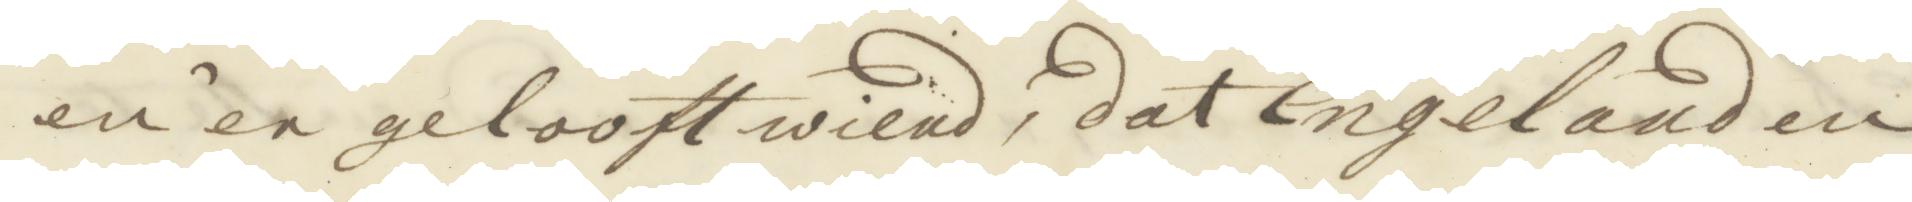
en er gelooft wierd, dat Engeland en
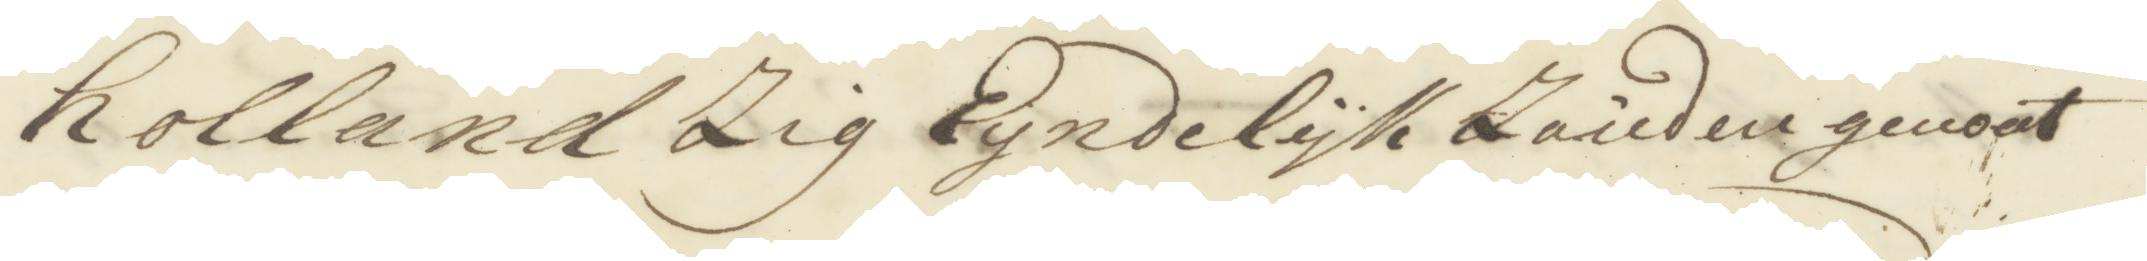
holland Zig Eijndelijk Zouden genoot
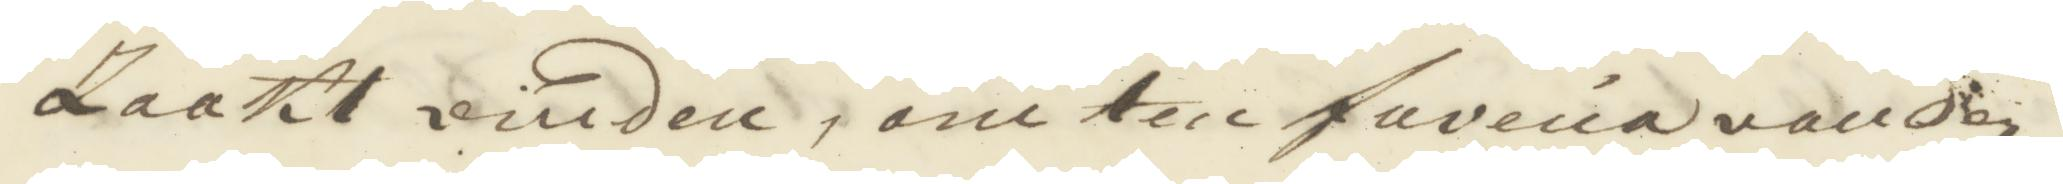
Zaakt vinden, om ten faveur van den
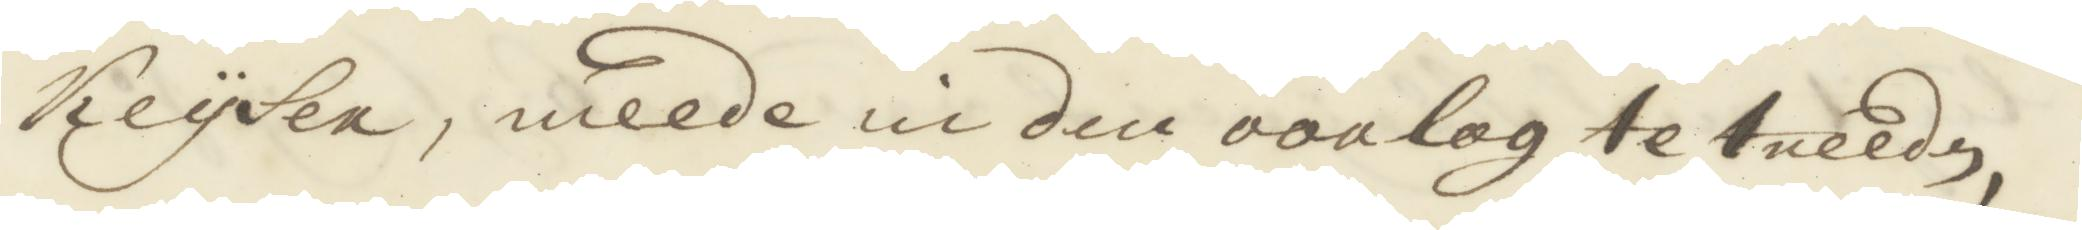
Keijser, meede in den oorlog te treeden,
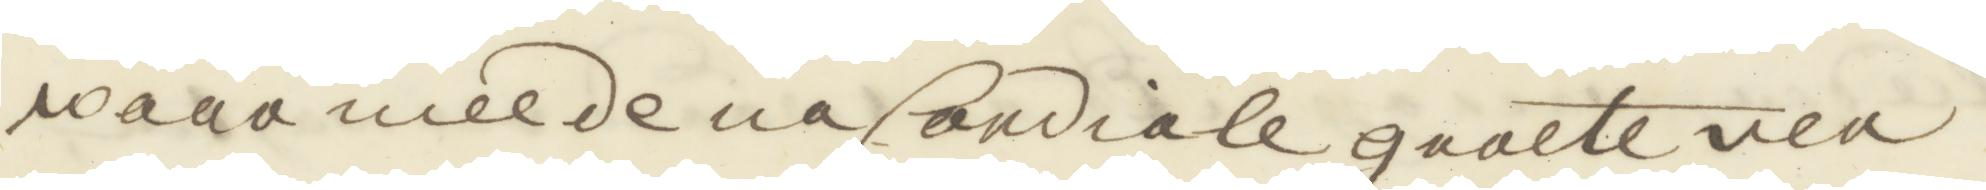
waar meede na Cordiale groete ver
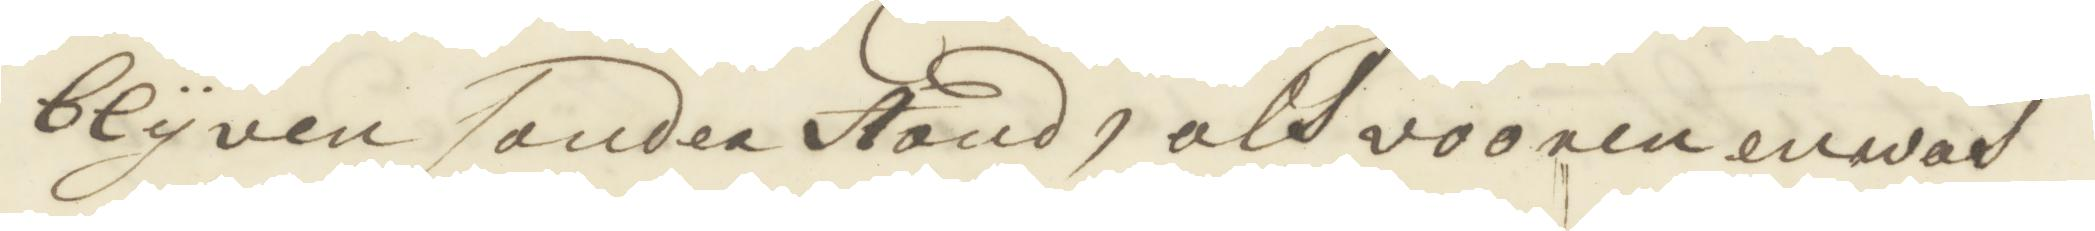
blijven / onder stond, als vooren en was
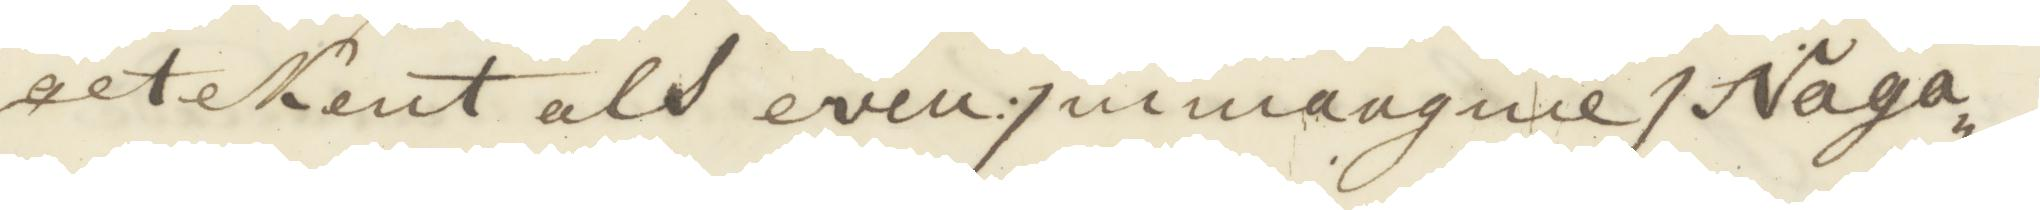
getekent als even :/ in marginie/ Naga„
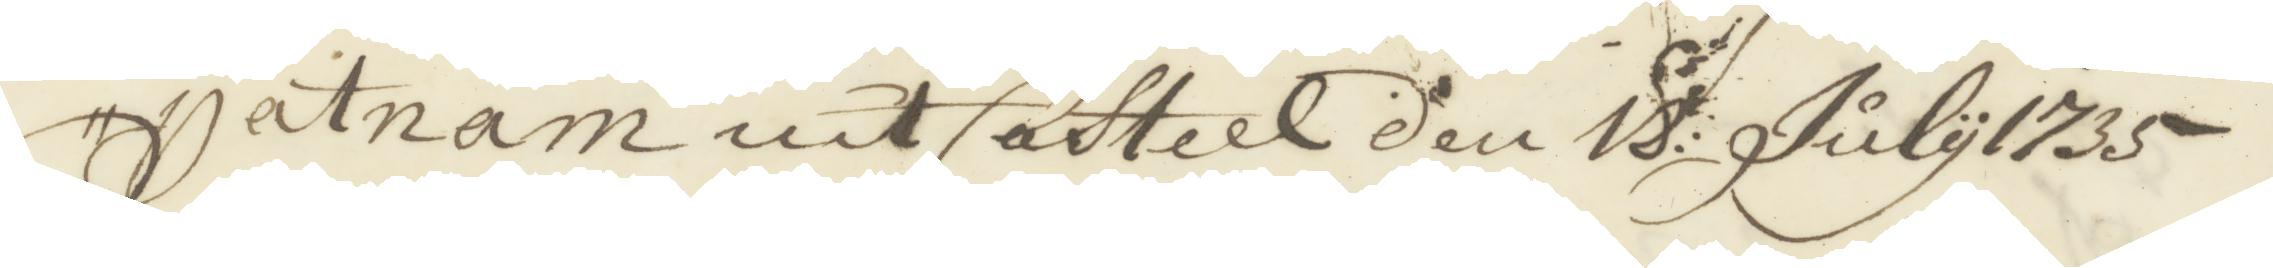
„patnam in't Casteel den 18:' Iulij 1735
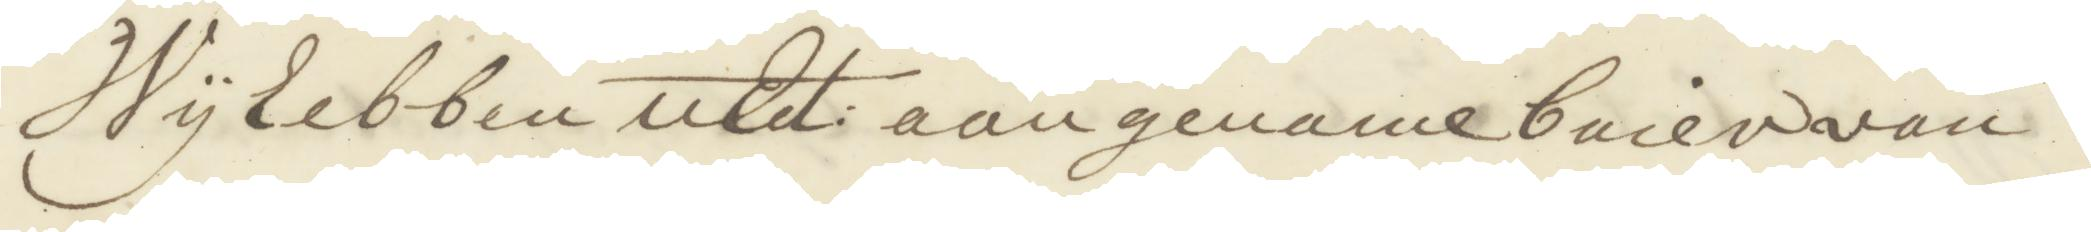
Wij hebben uEd: aangename briev van
